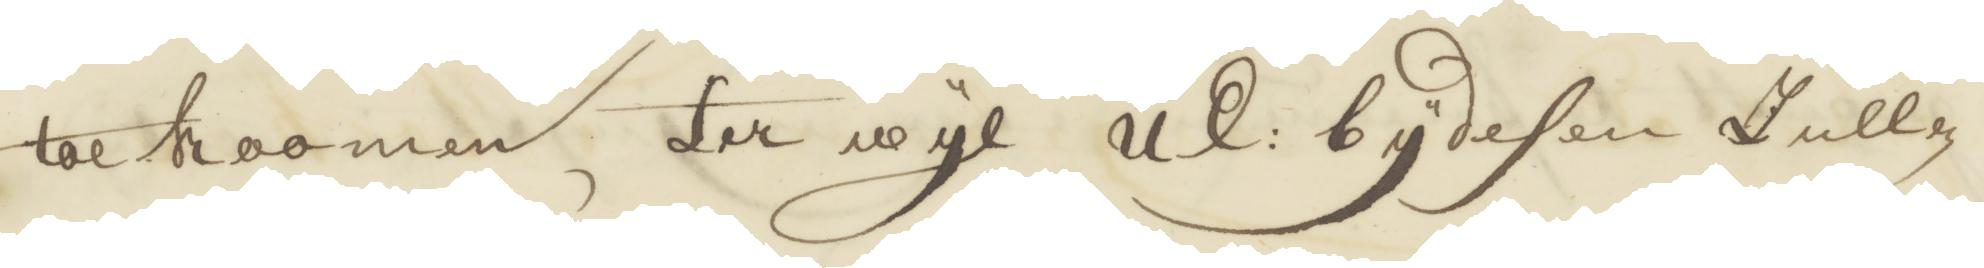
toekoomen, ter wijl uE: bij desen Zullen
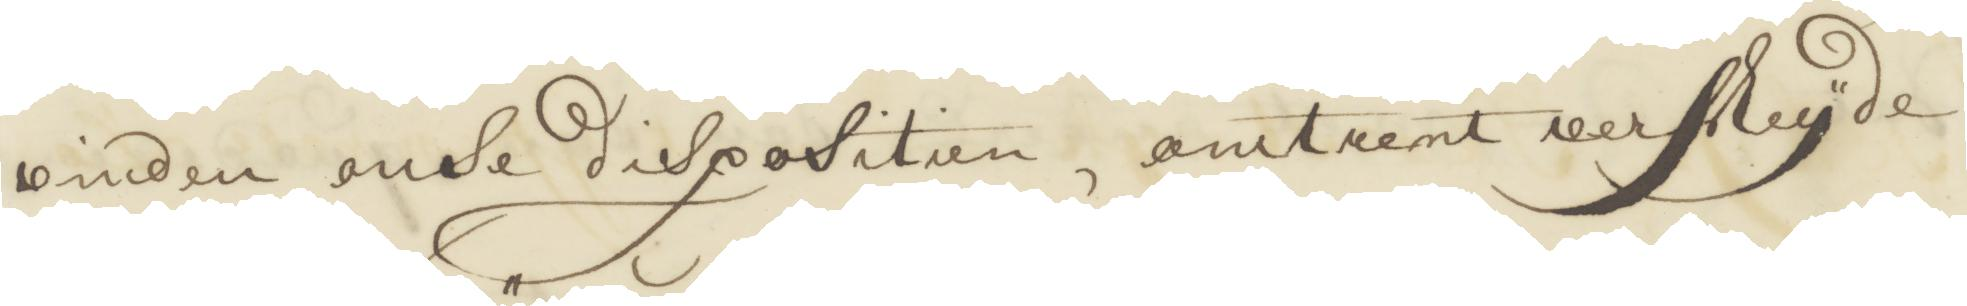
vinden onse dispositien, omtrent verscheijde
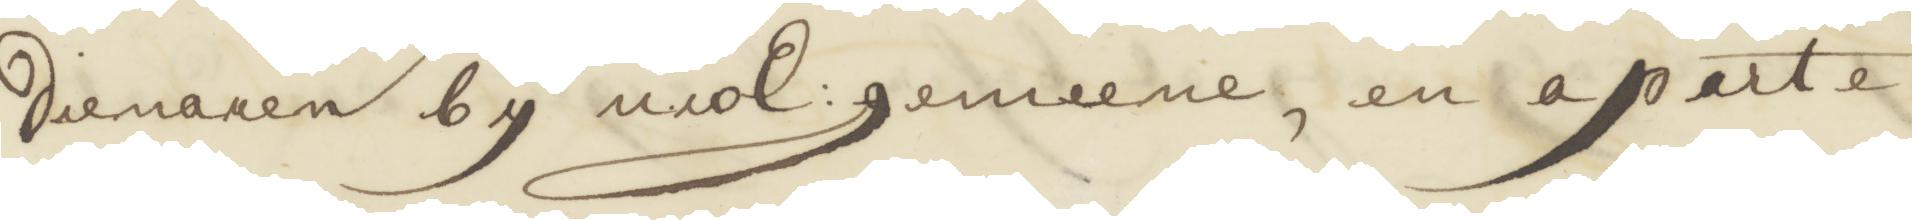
dienaren bij uwE: gemeene, en aparte
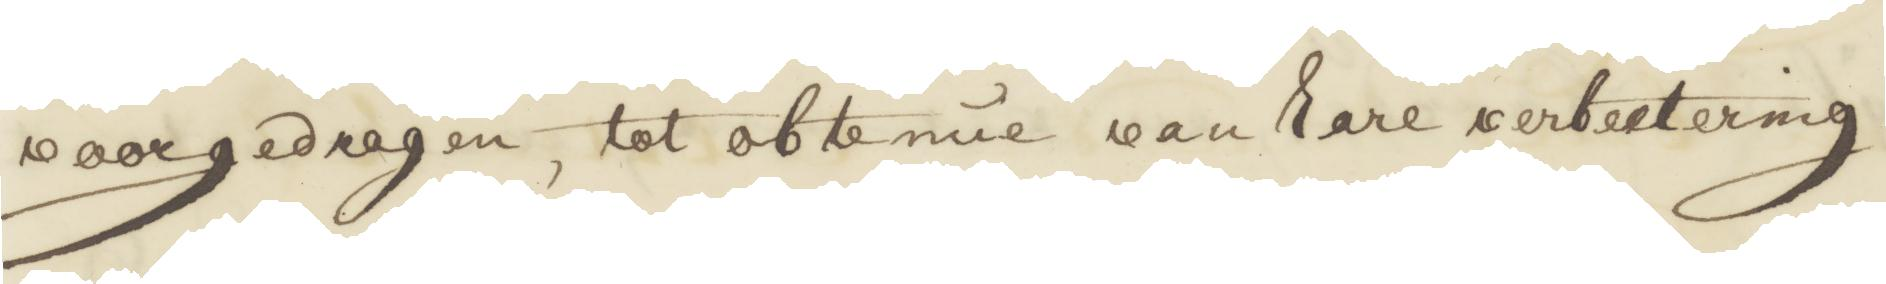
voorgedragen, tot obtenue van hare verbeetering
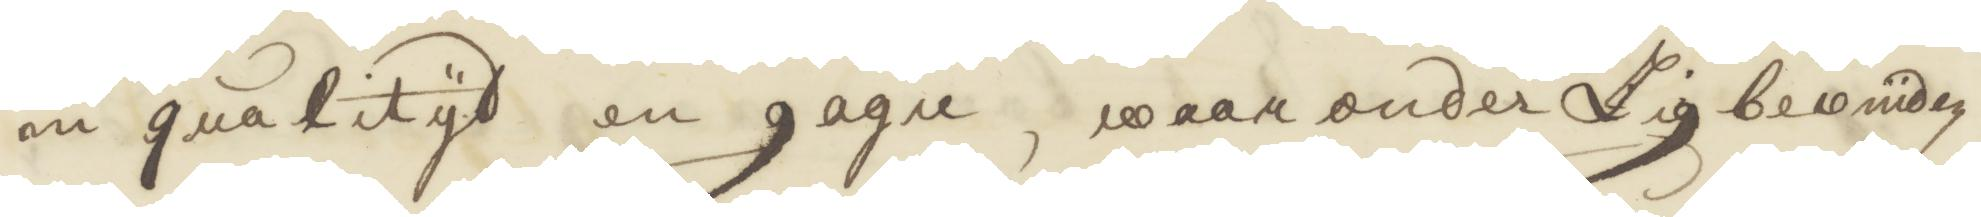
in qualitijd en gagie, waar onder Zig bevinden
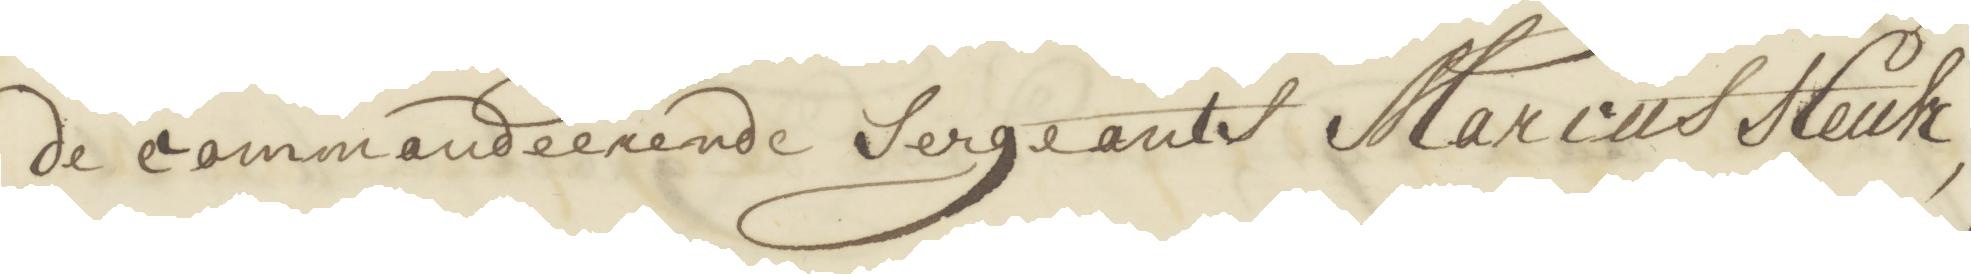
de commandeerende sergeants Marcus Heuk,
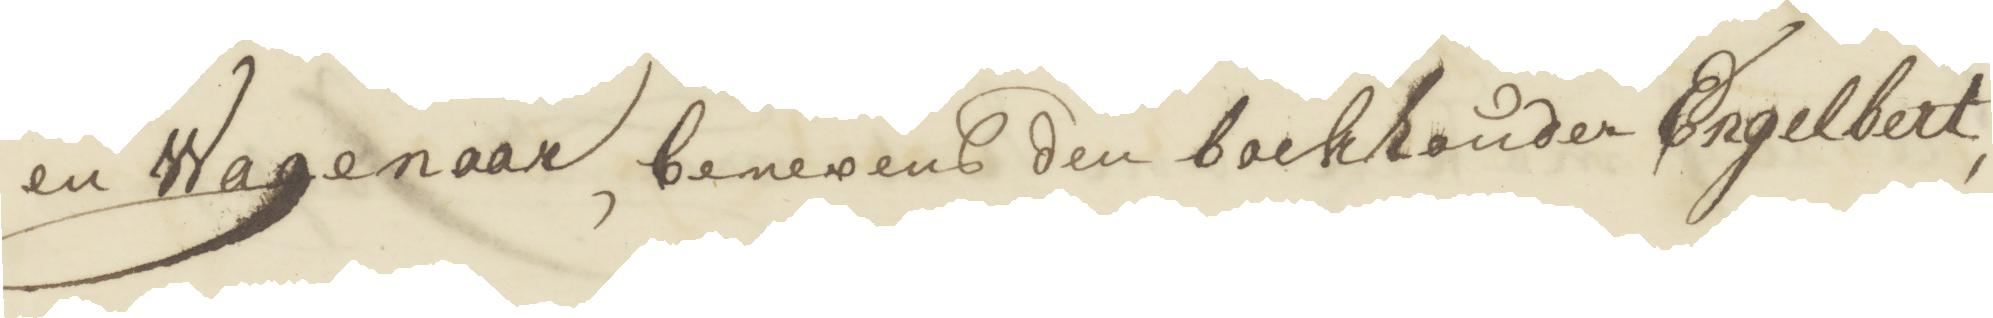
en Wagenaar, benevens den boekhouder Engelbert,
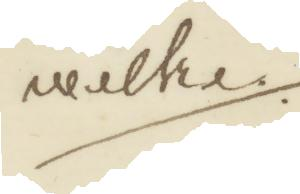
welke.
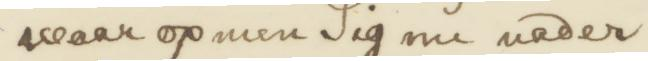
waar op men Sig nu nader
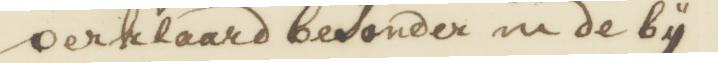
verklaard besonder in de bij
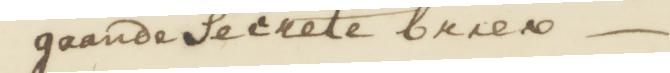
gaande secrete briev
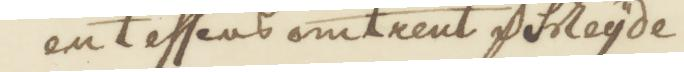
en ’t effens omtrent verscheijde
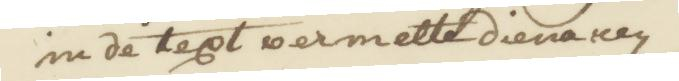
in de text vermelte dienaken
